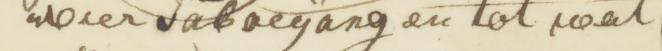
vier Taboeijang en tot wat
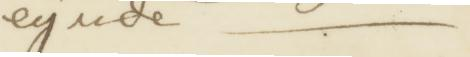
eijnde —
